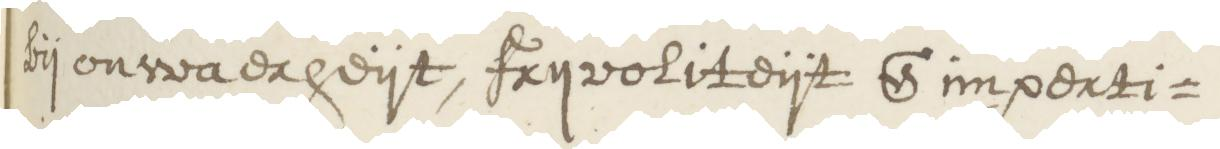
bij onwaerheijt, fryvoliteijt ende imperti=
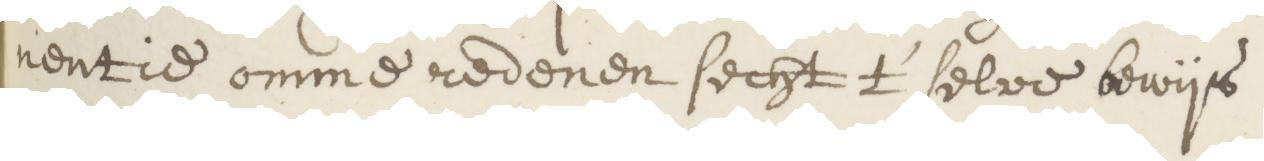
nentie omme redenen secht t' selve bewijs
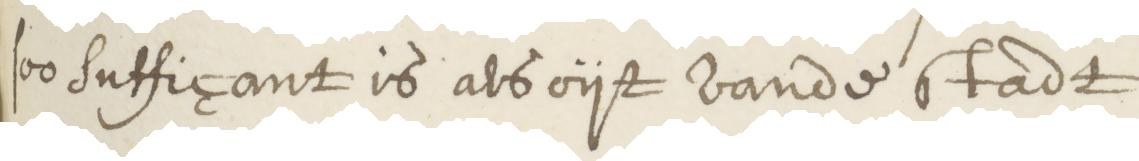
soo sufficant is als oijt vande stadt
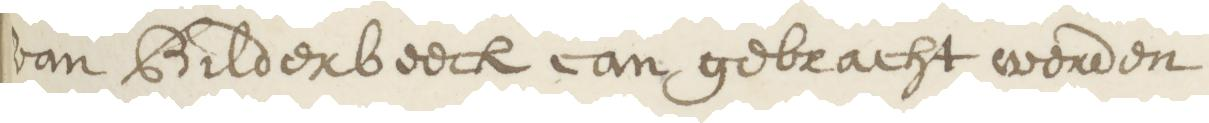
van Bilderbeeck can gebracht werden
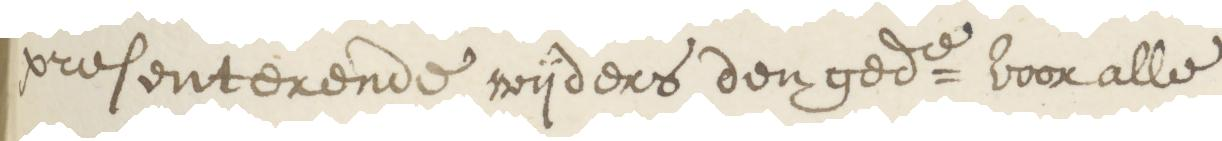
presenterende wijders den ged=e voor alle
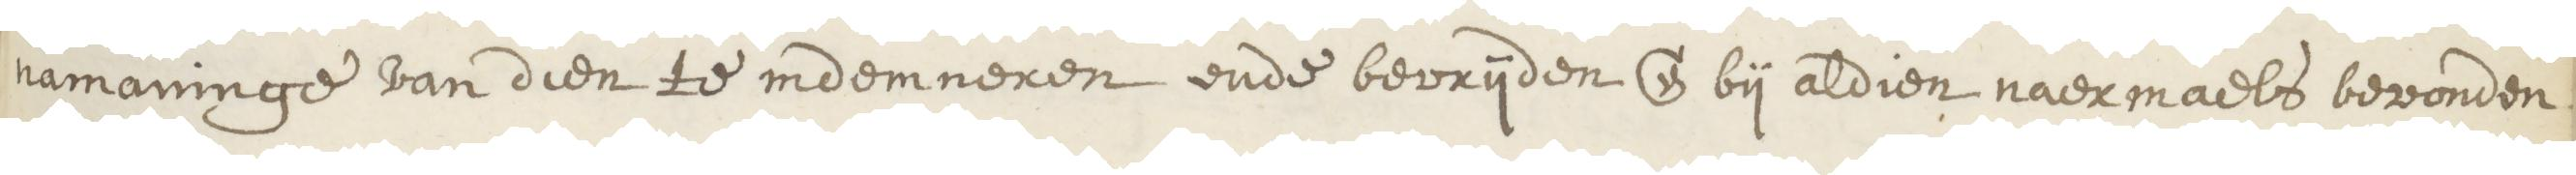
namaninge van dien te indemneren ende bevrijden ende bij aldien naermaels bevonden
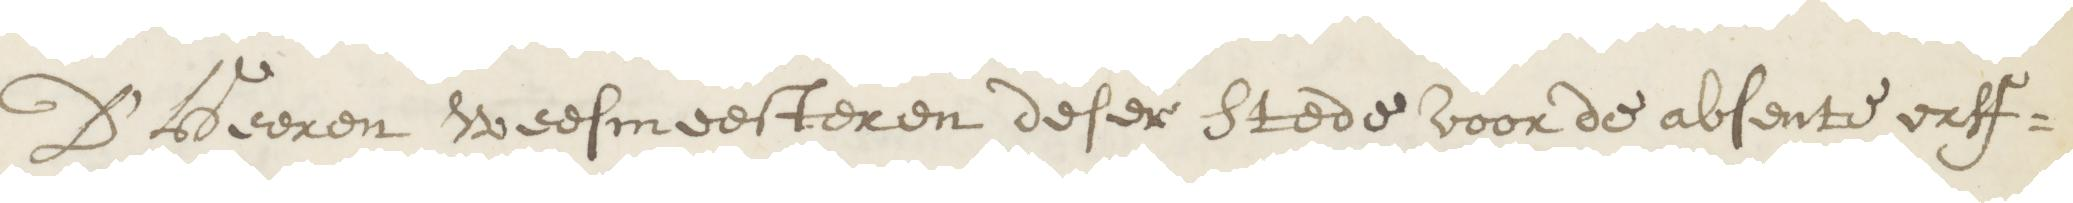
D' Heeren weesmeesteren deser stede voor de absente erff=
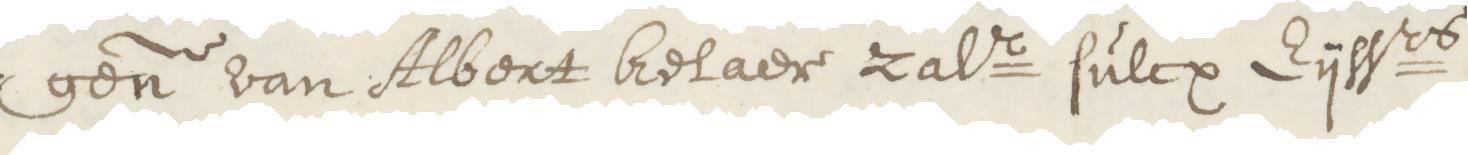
gen van Albert kelaer zal=r sulcx Eijss=rs
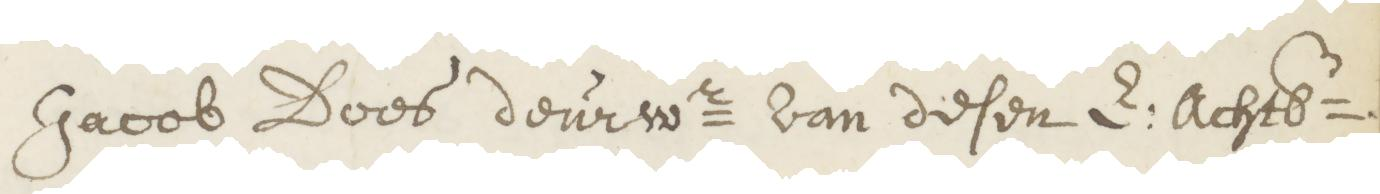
Jacob Does deurw=r van desen E: Achtb=n
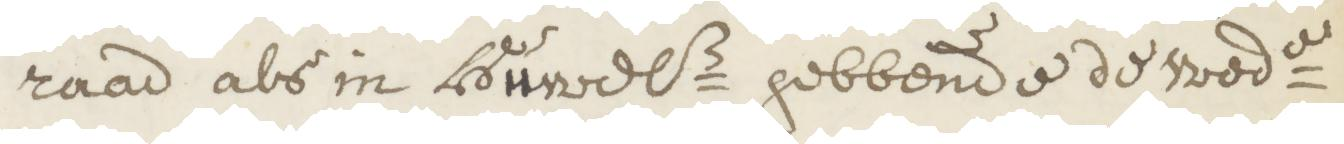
raad als in Huwelijk hebbende de wed=e
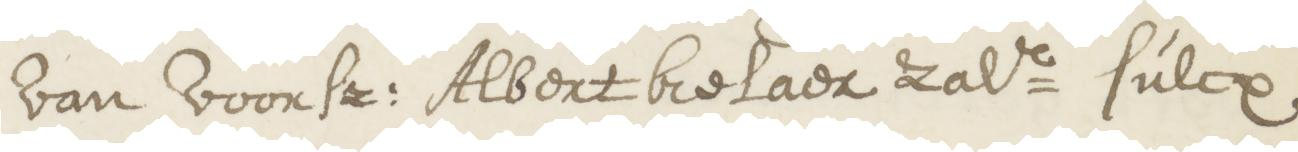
van voorsz: Albert kelaer zal=r sulcx
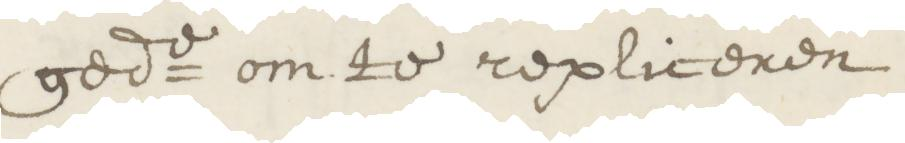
ged=e om te repliceren
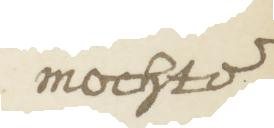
mochte
